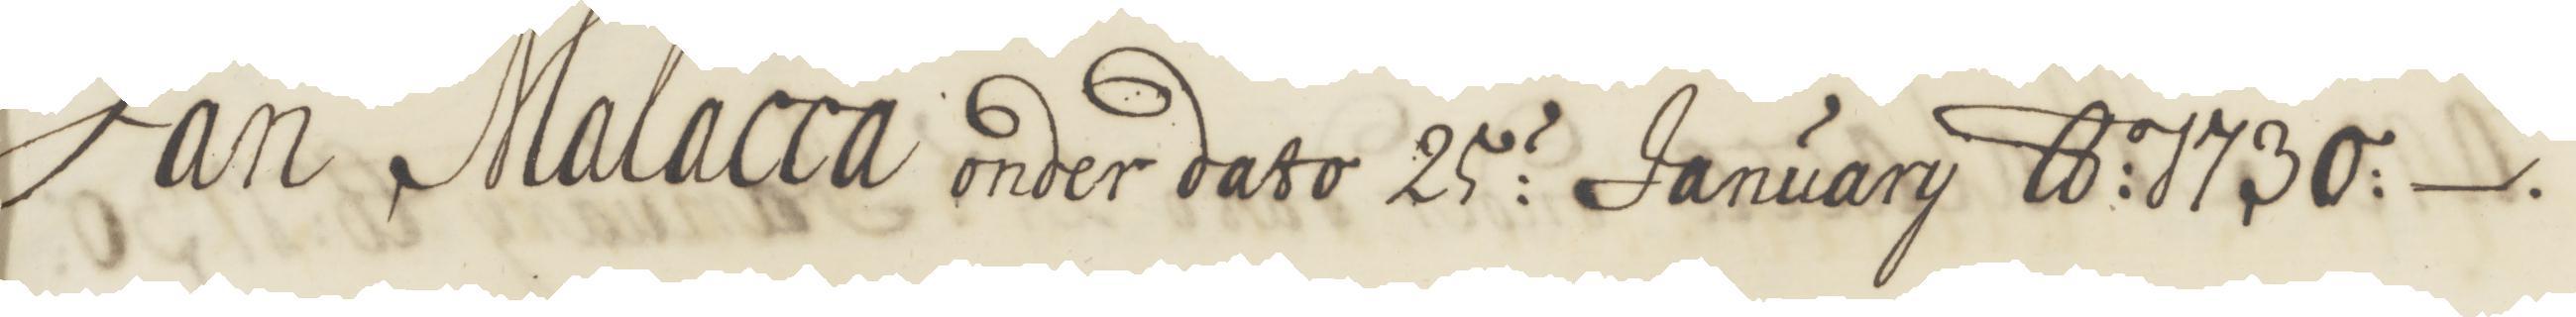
Van Malacca onder dato 25:' Januarij A:o 1730:_.
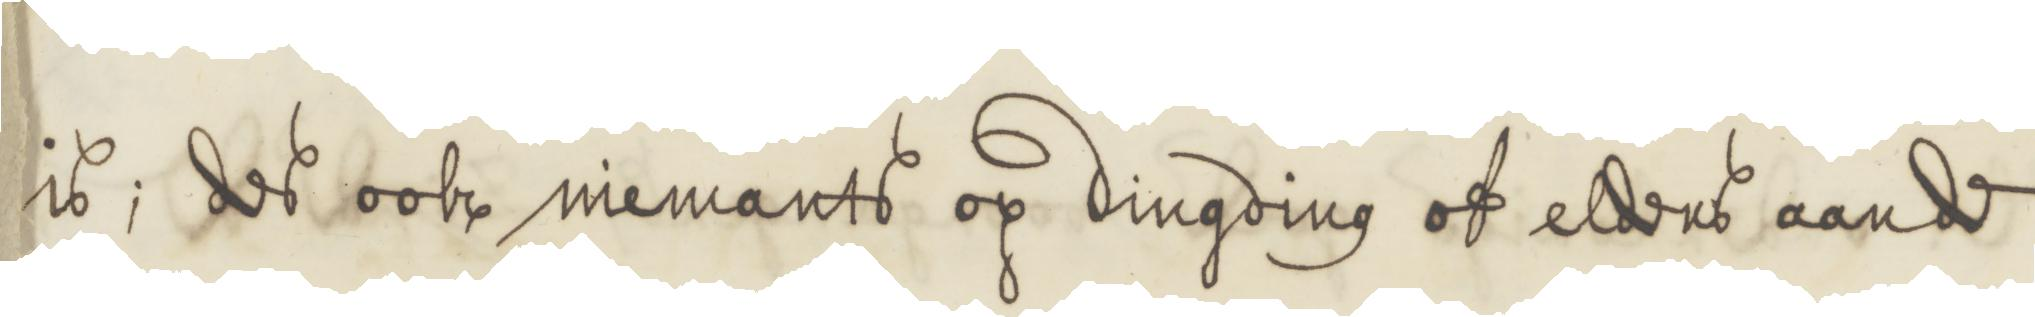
is; des ook niemants op dingding of elders aan de
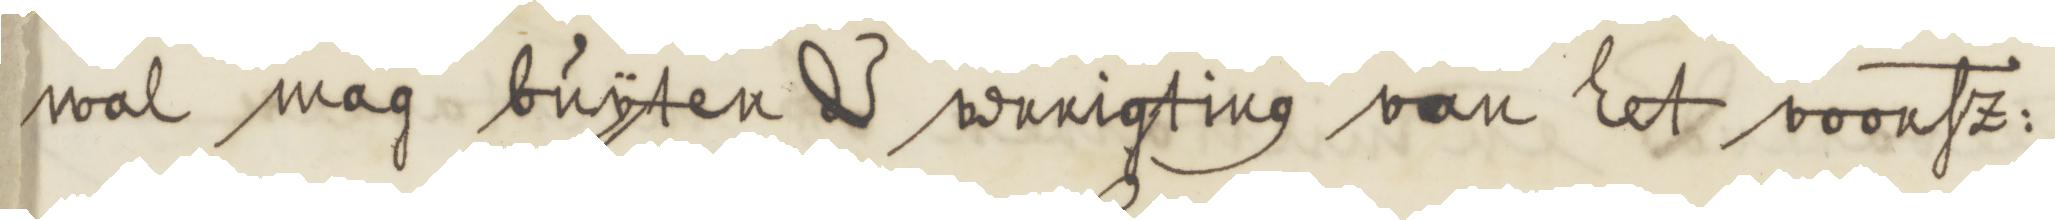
wal mag buijten de verrigting van het voorsz:
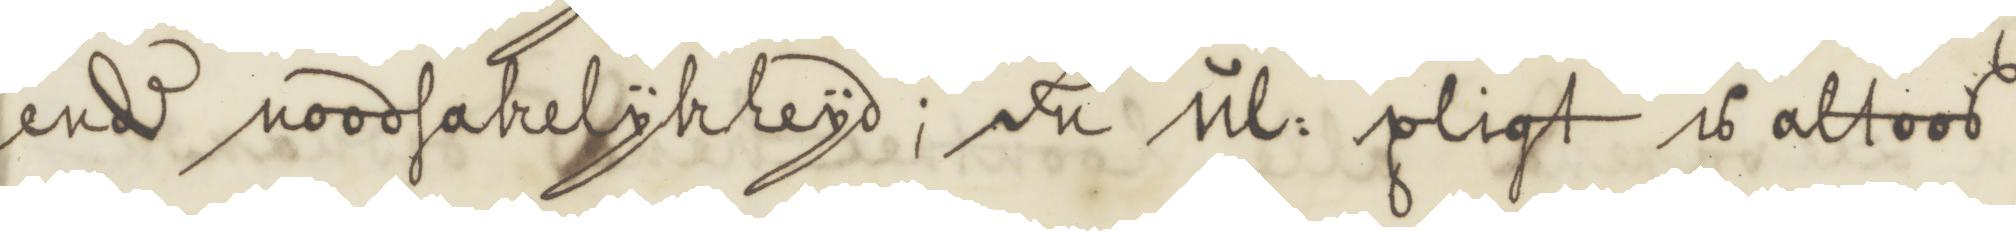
ende noodsakelijkheijd; En ul: pligt is altoos
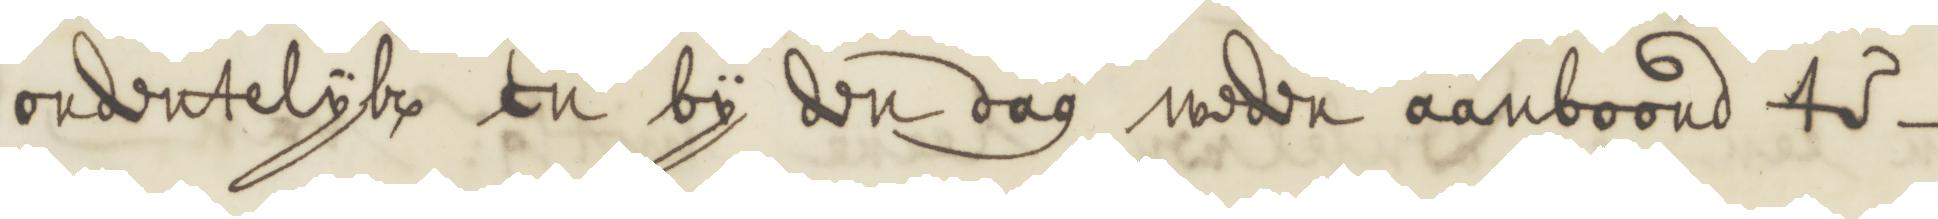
ordentelijk en bij den dag weder aanboord te _
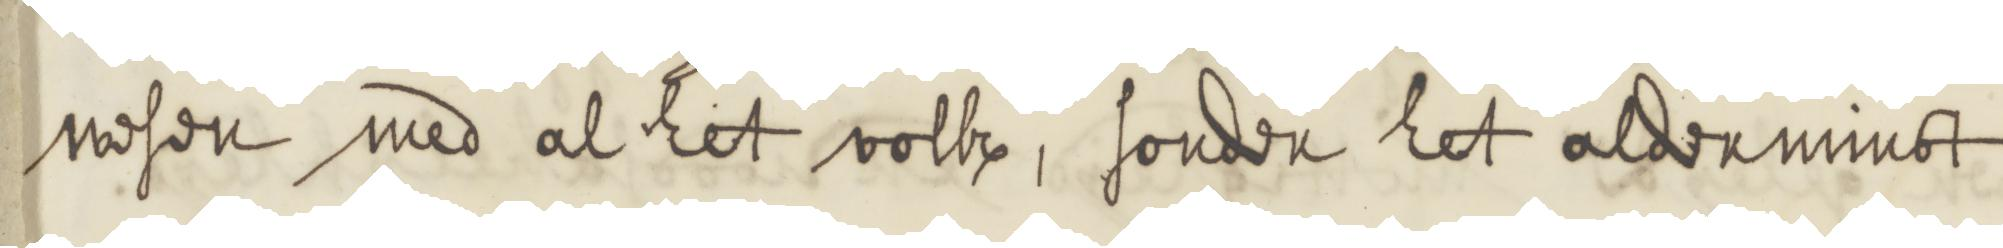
wesen med al het volk, sonder het alderminst
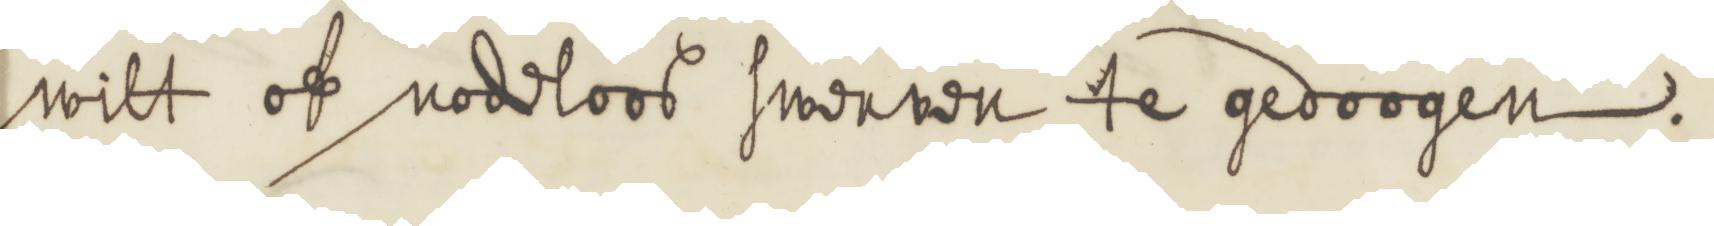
wilt of nodeloos swerven te gedoogen.
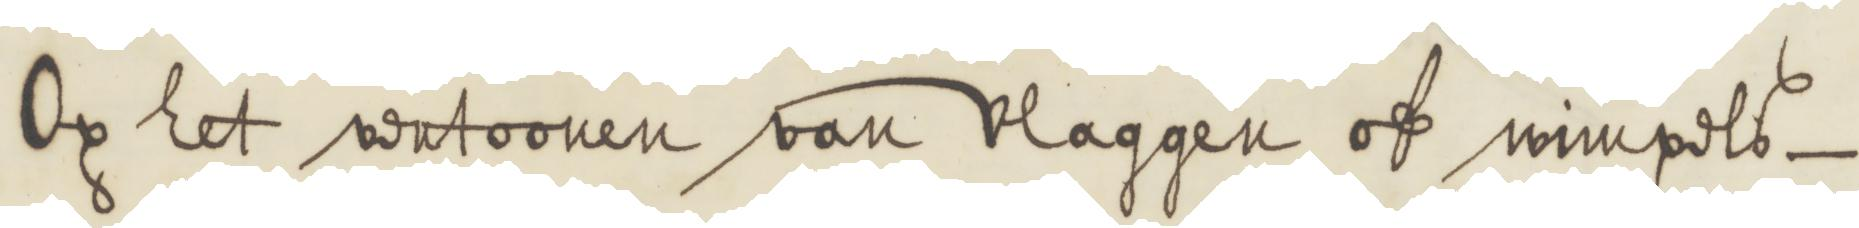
Op het vertoonen van vlaggen of wimpels _
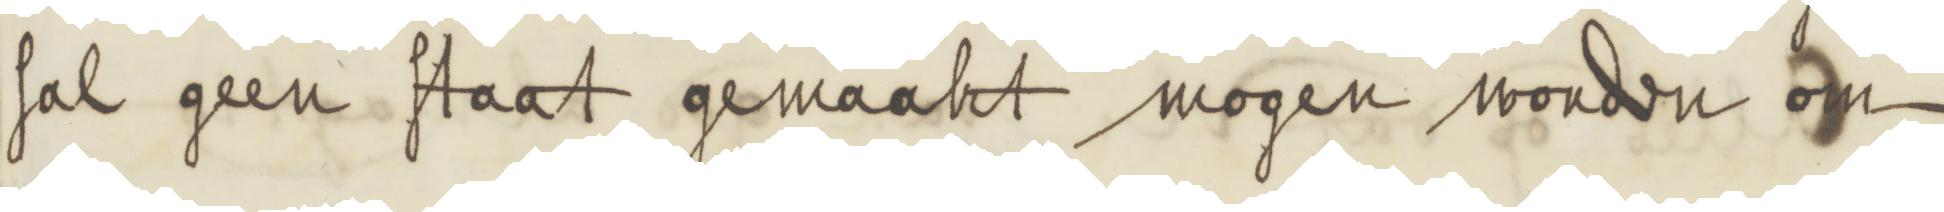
sal geen staat gemaakt mogen worden om
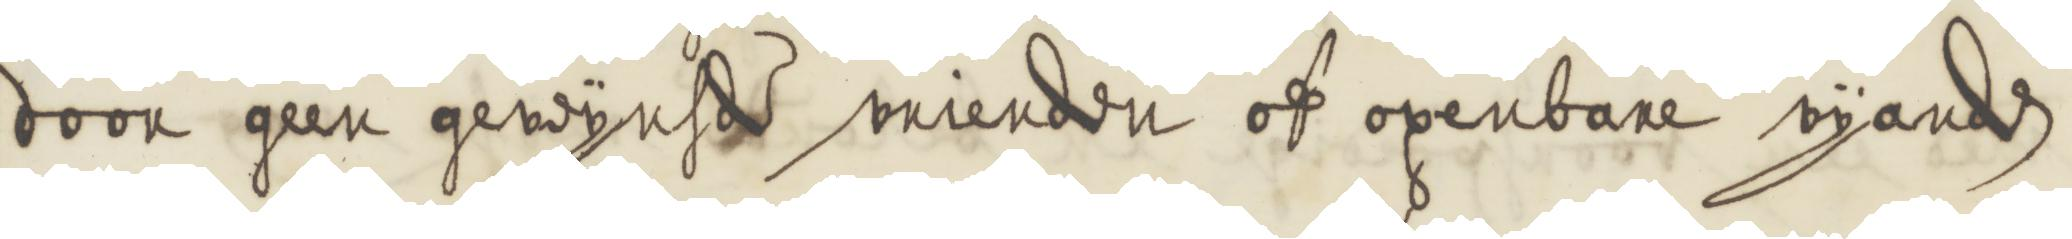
door geen geveijnsde vrienden of openbare vijanden
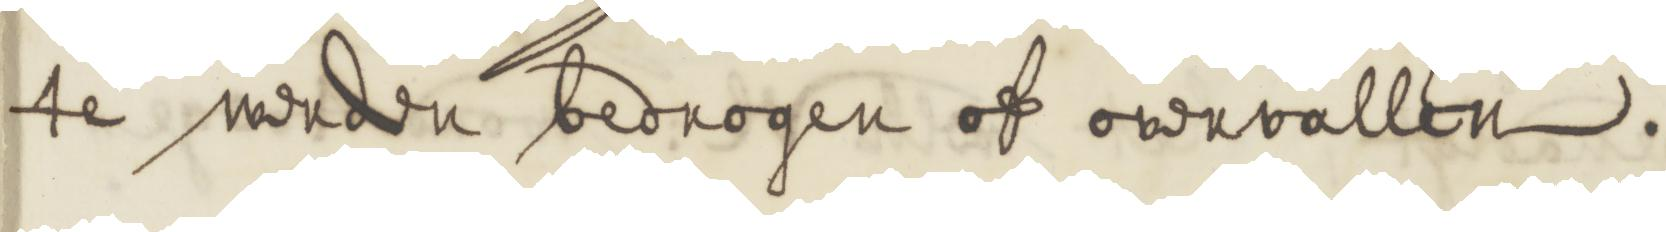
te werden bedrogen of overvallen.
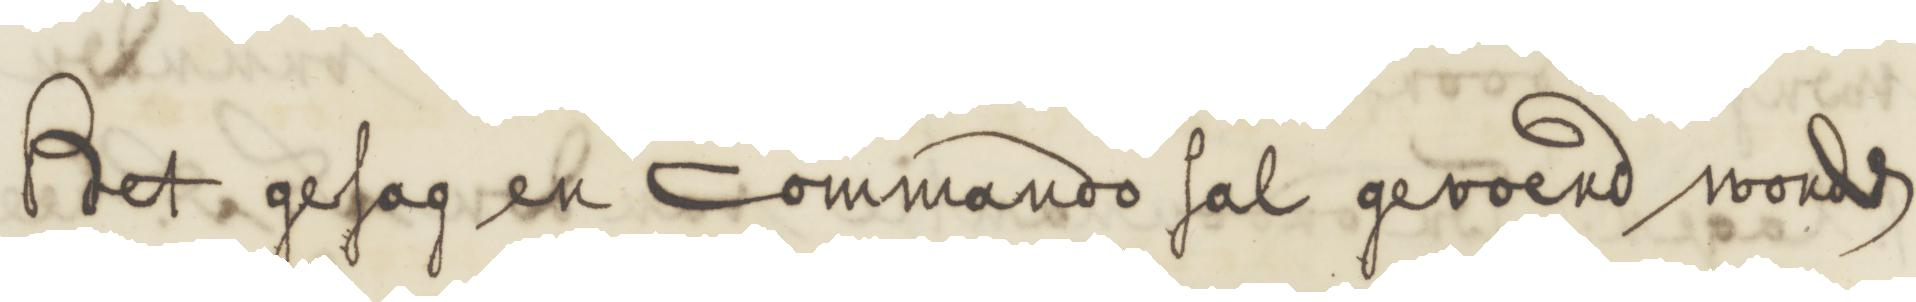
Het gesag en commando sal gevoerd worden
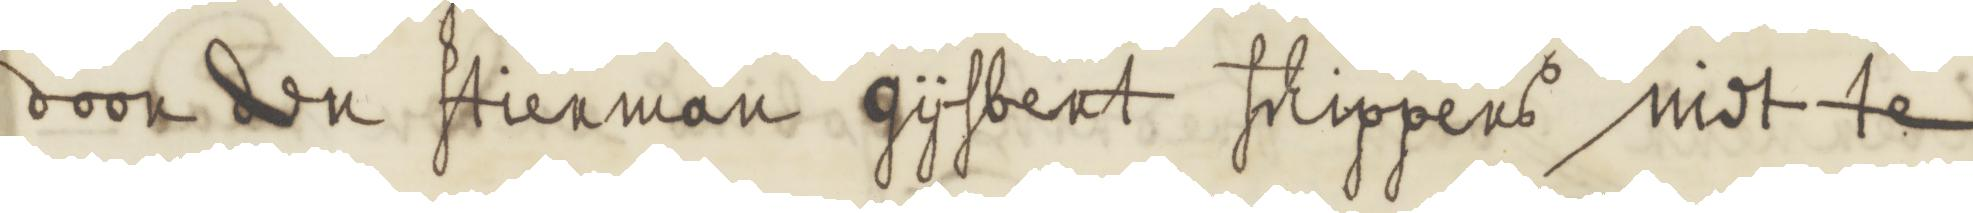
door den stierman gijsbert schippers niet te
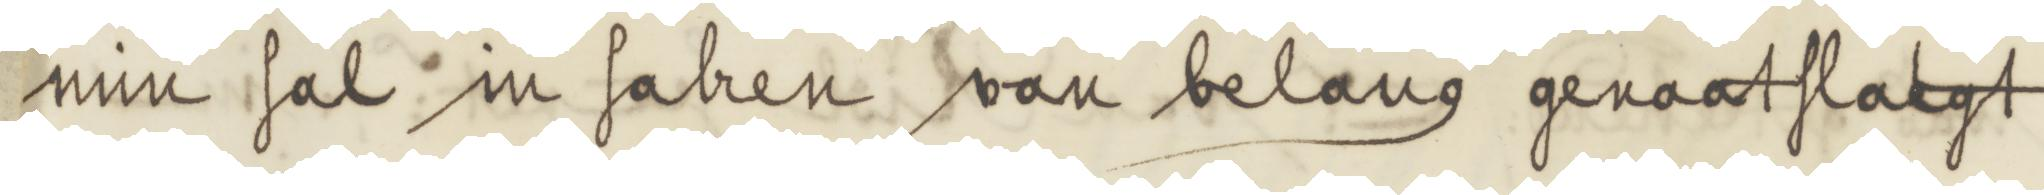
min sal in saken van belang geraatslaegt
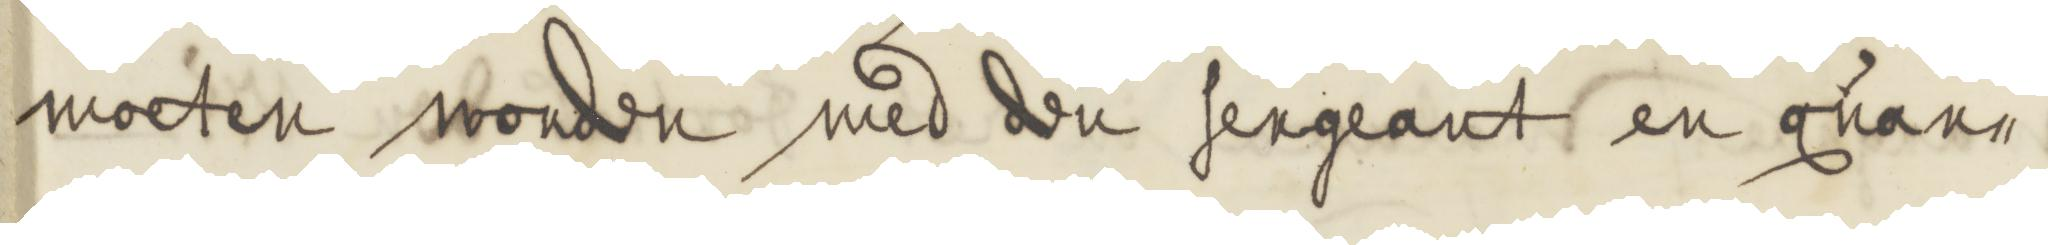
moeten worden med den sergeant en quar„
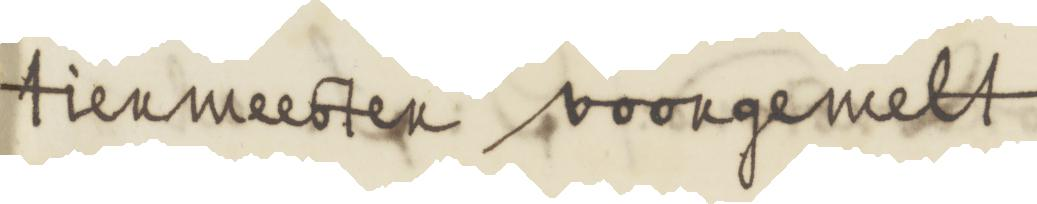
tiermeester voorgemelt
